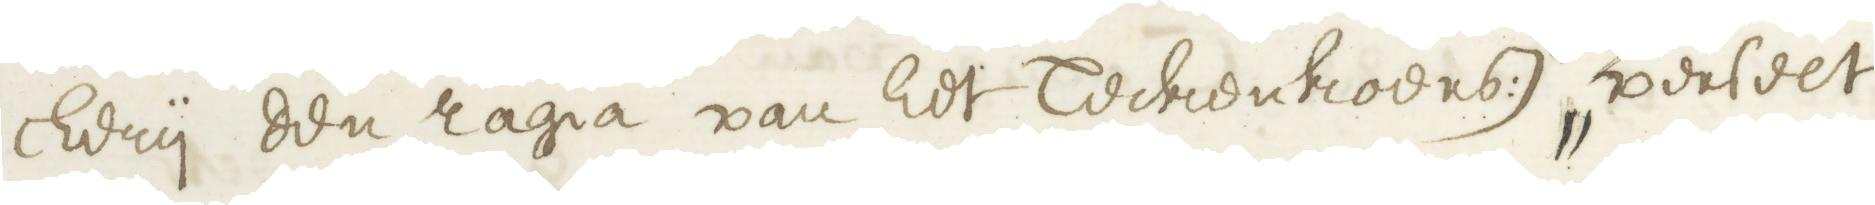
cherij den ragia van het Teckenkoerlijk „ verselt
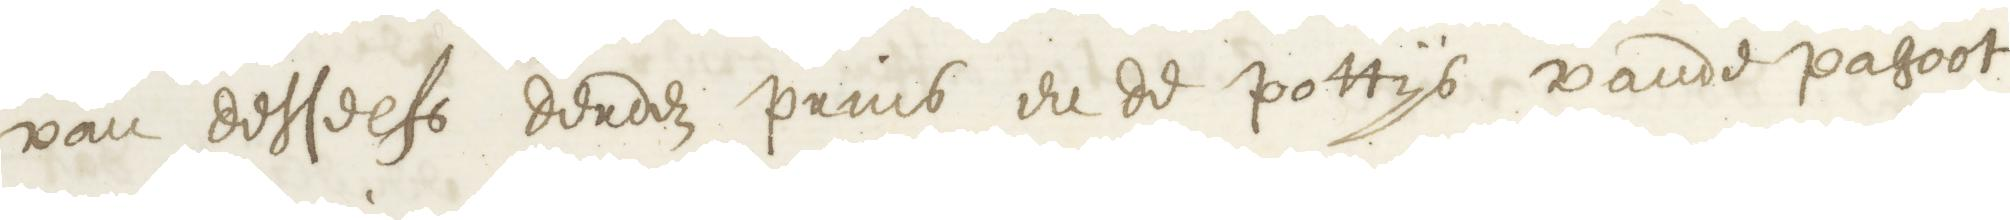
van desselfs derden prins en de pottijs vande pagoot
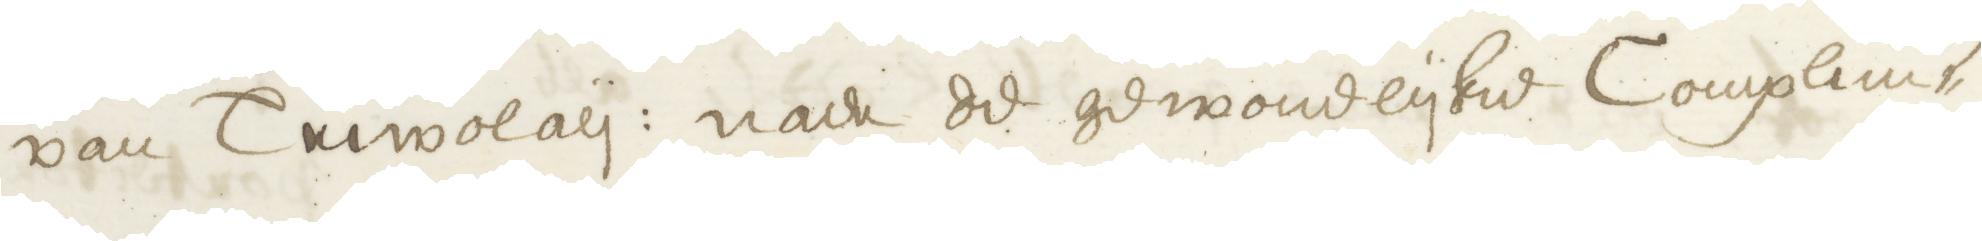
van Triwolaij: naer de gewonelijke Complim„ten
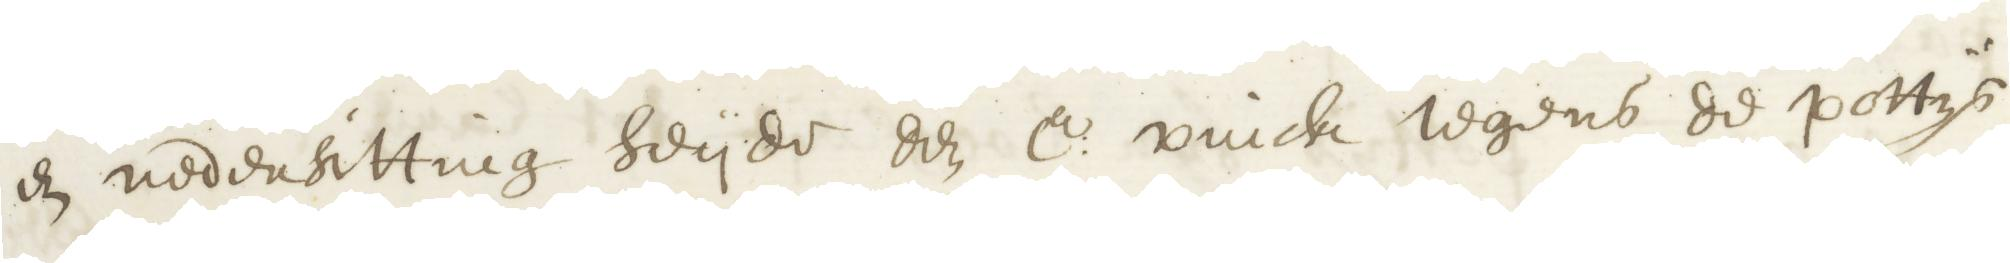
en nedersitting seijde den E: vinck tegens de pottijs
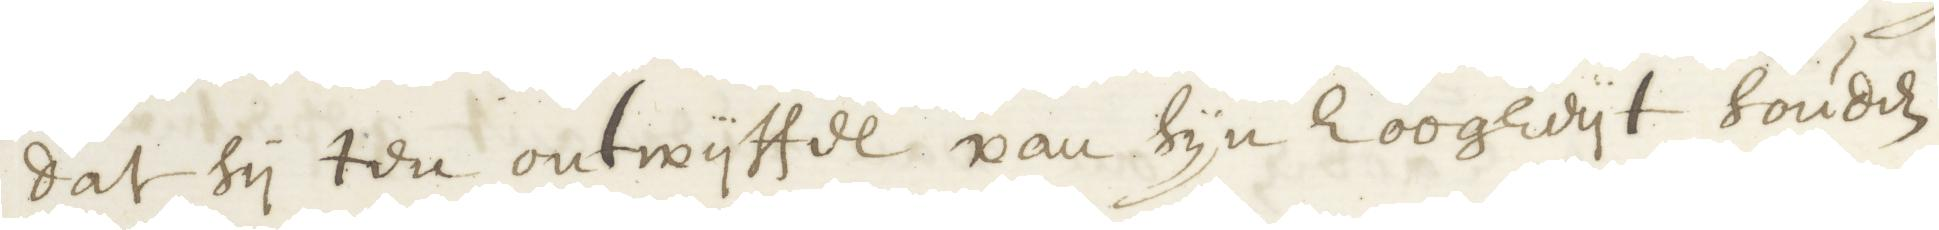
dat sij ten ontwijffel van sijn hoogheijt souden
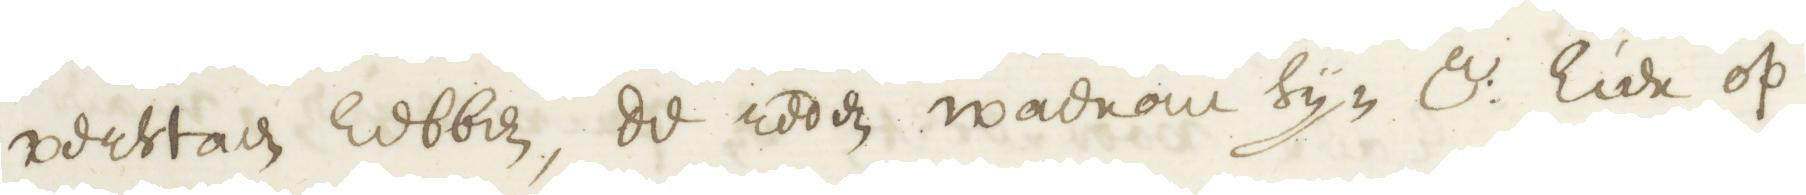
verstaen hebben, de reden waerom sijn E: hier op
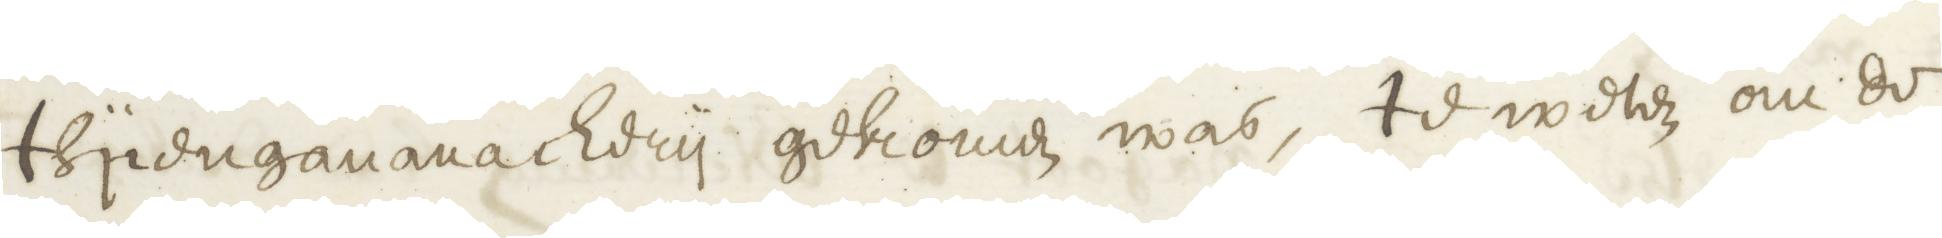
tsjienganaracherij gekomen was, te weten om de
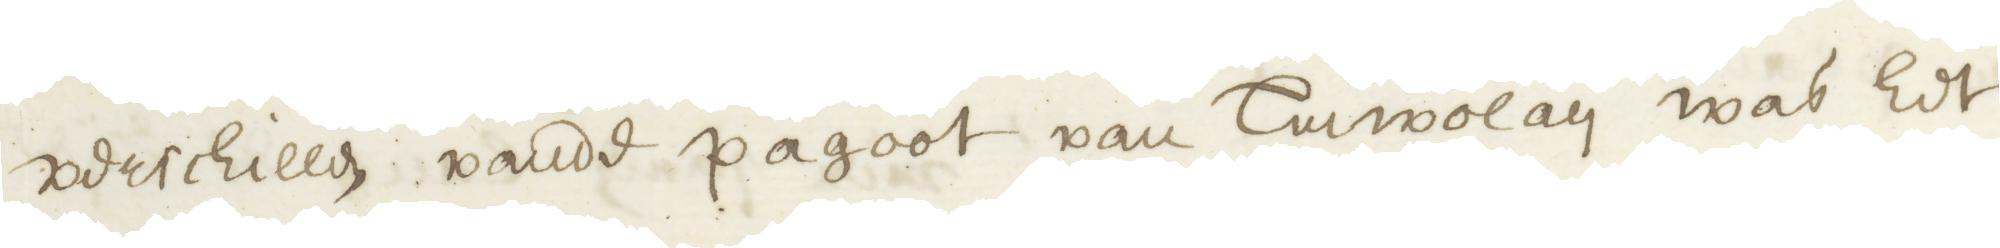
verschillen vande pagoot van Triwolaij was het
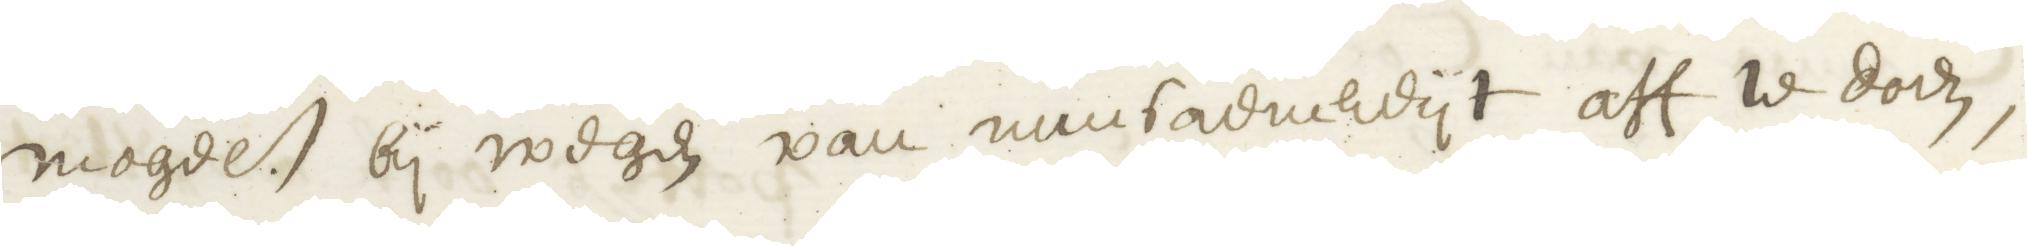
mogelijk bij wegen van minsaemheijt aff te doen,
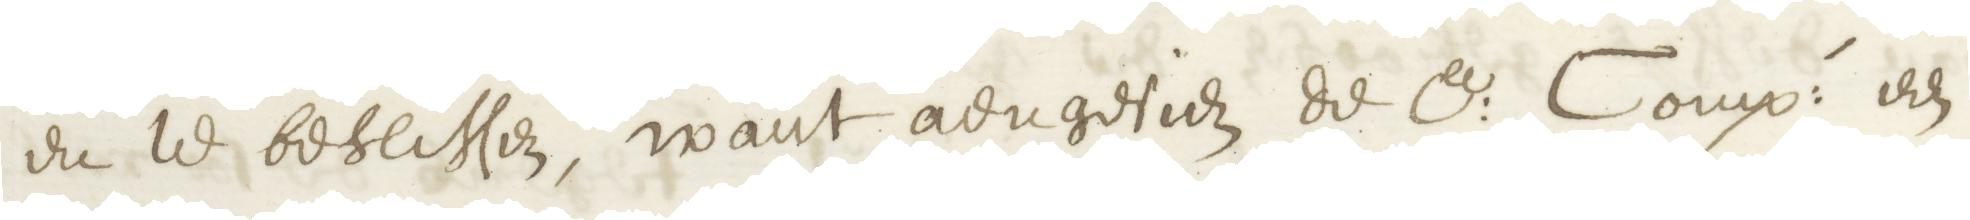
en te beslissen, want aengesien de E: Comp:' een
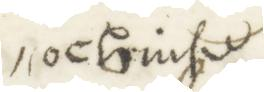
„ochinse
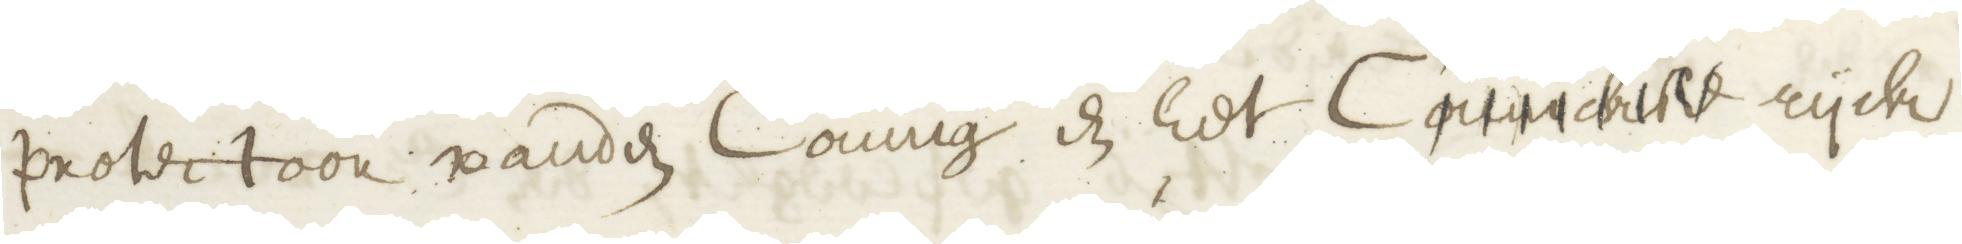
protectoor vanden Coning en het Coitchse rijck
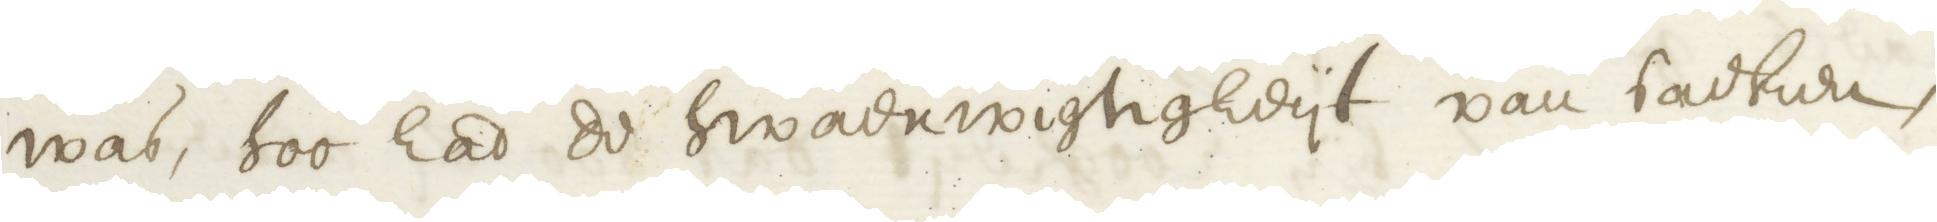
was, soo had de swaerwigtigheijt van saeken,
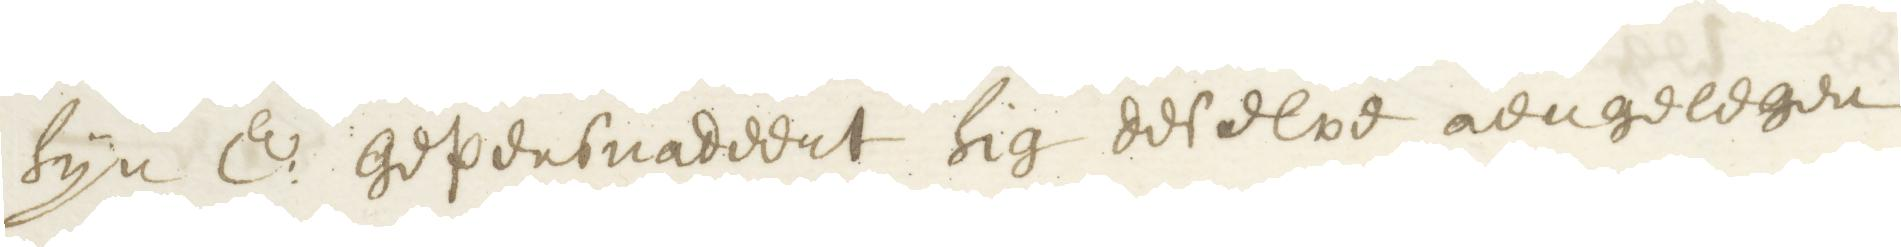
sijn E: gepersuadeert sig deselve aengelegen
